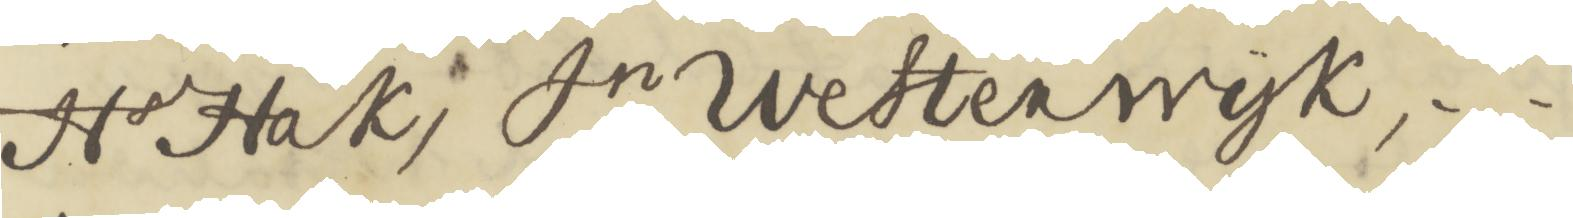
Hs Hak, J„r Westerwijk, - -
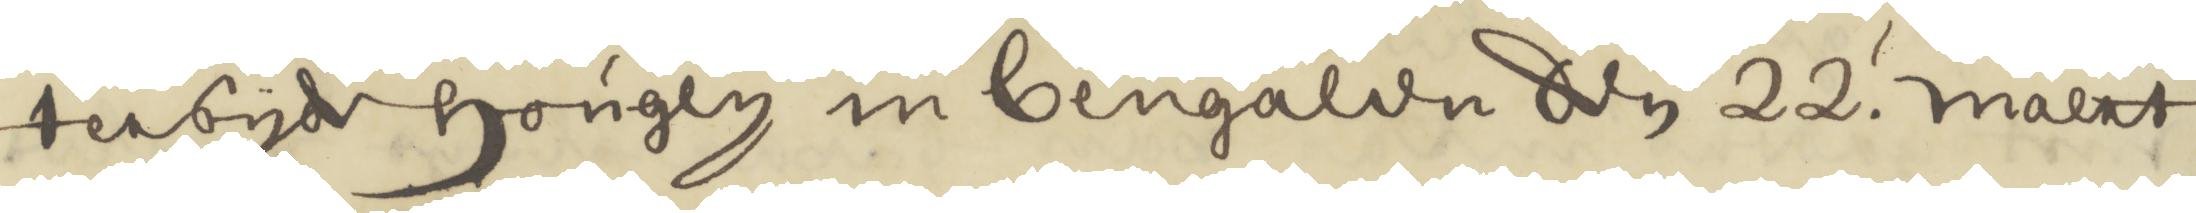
ter sijde houglij in bengalen den 22.' maert
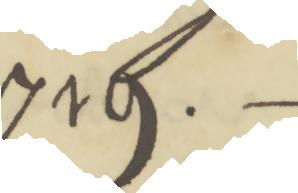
1719. —
